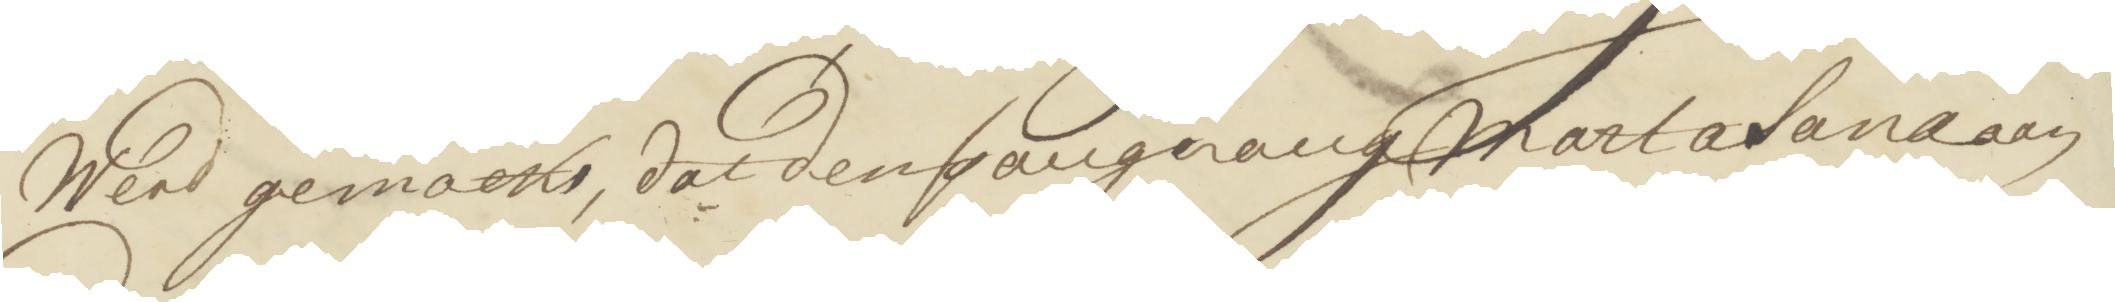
werd gemaekt, dat den pangerang martasana aan
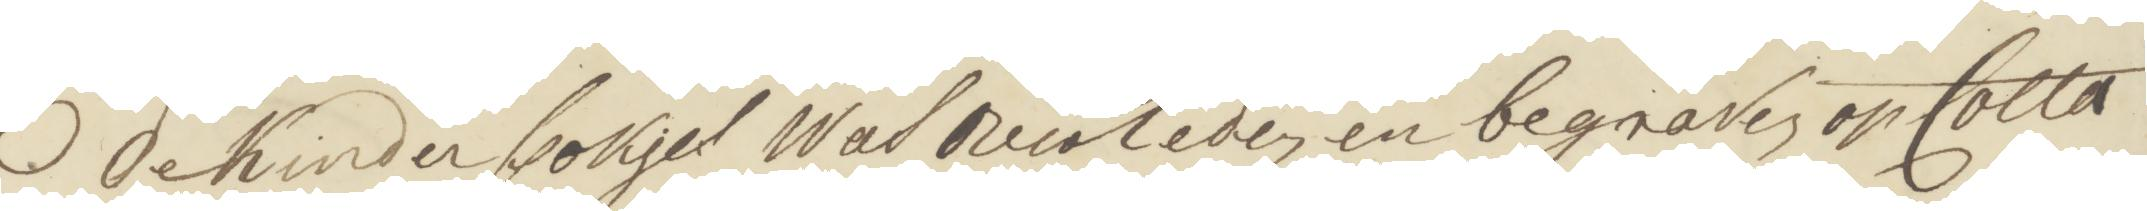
de kinderpokjes was overleden en begraven op Cotta
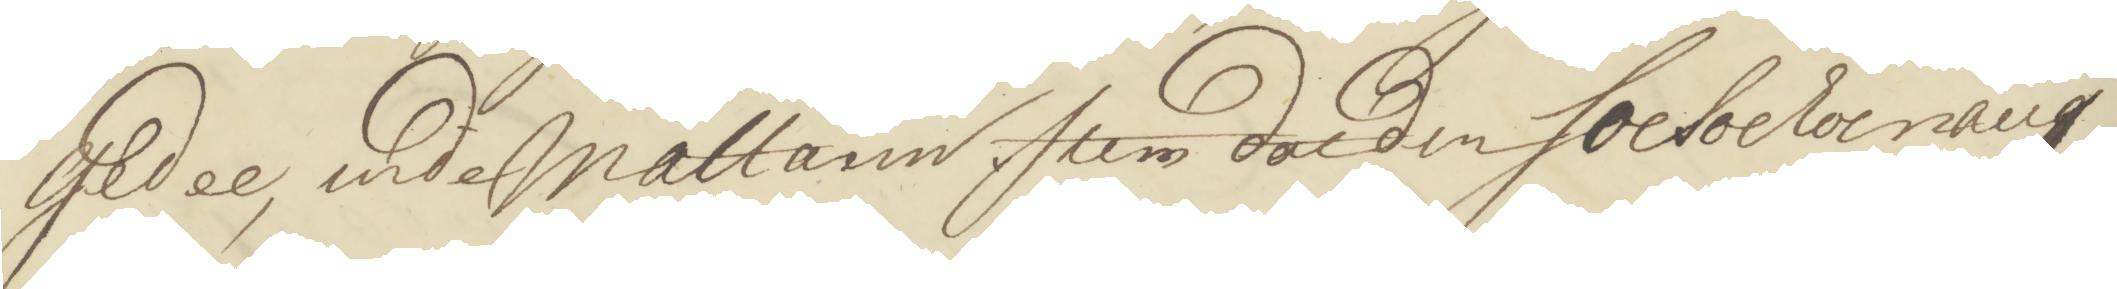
Gedee, inde mattarm Jtem dat den soesoehoenang
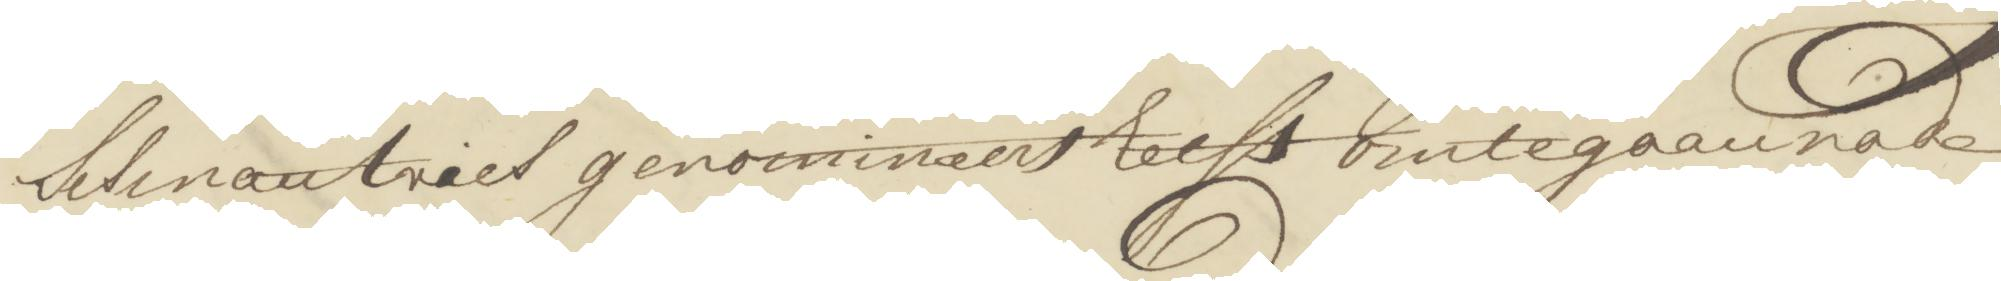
sesinantries genomineert heeft omtegaan na de
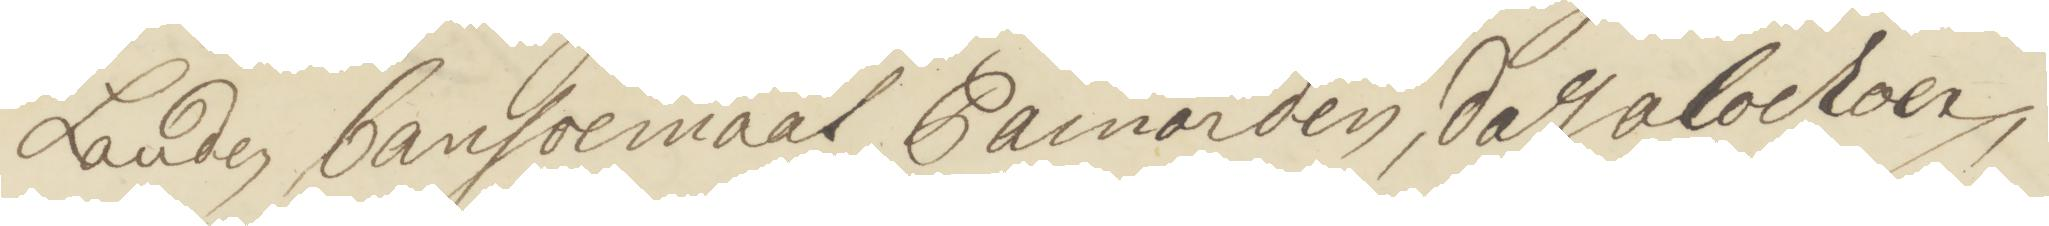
landen bansoemaal Pamorden, dajaloehoer,
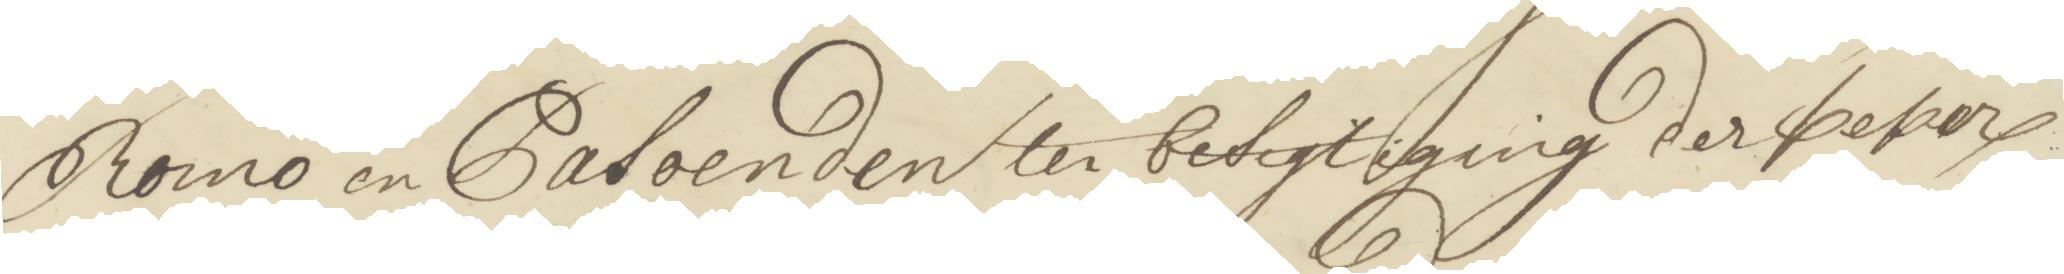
Romo en Pasoen den ter besigtiging der peper
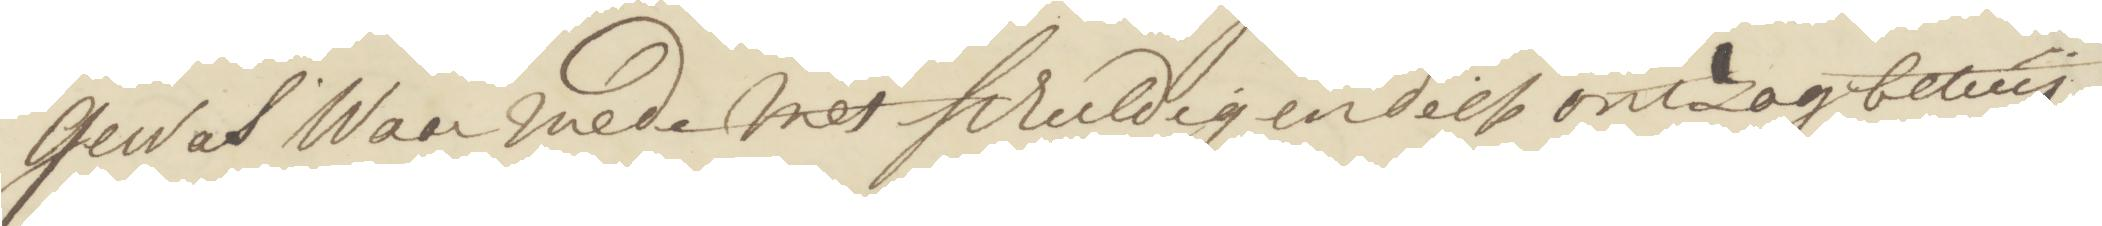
gewas waar mede met schuldig en diep ontzag betuij„
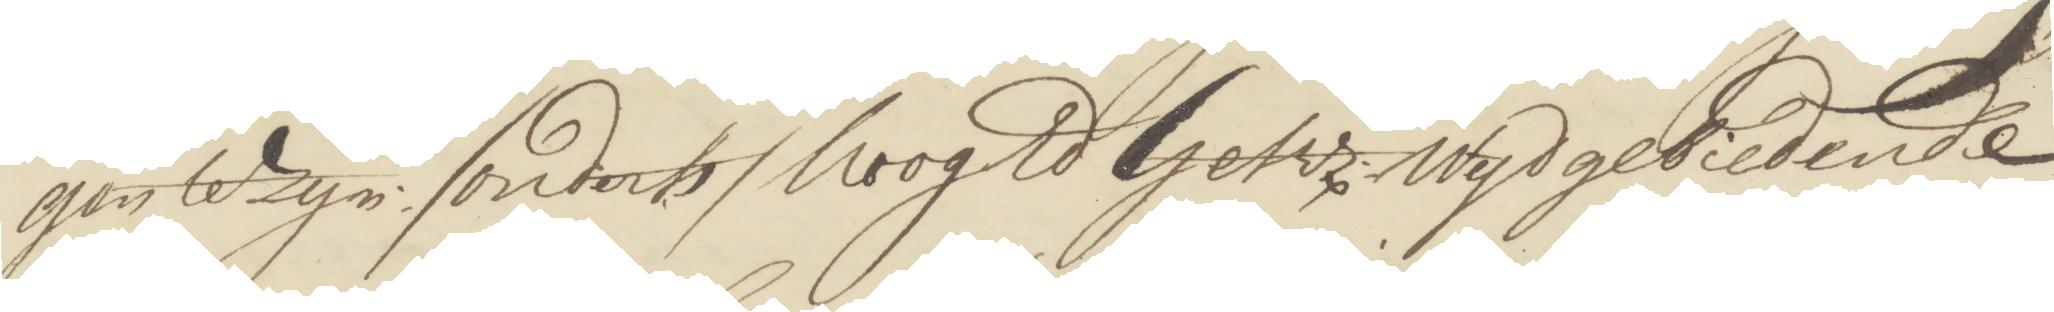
gen te zyn :/onderst/ hoog Ed Getrz: wyd gebiedende
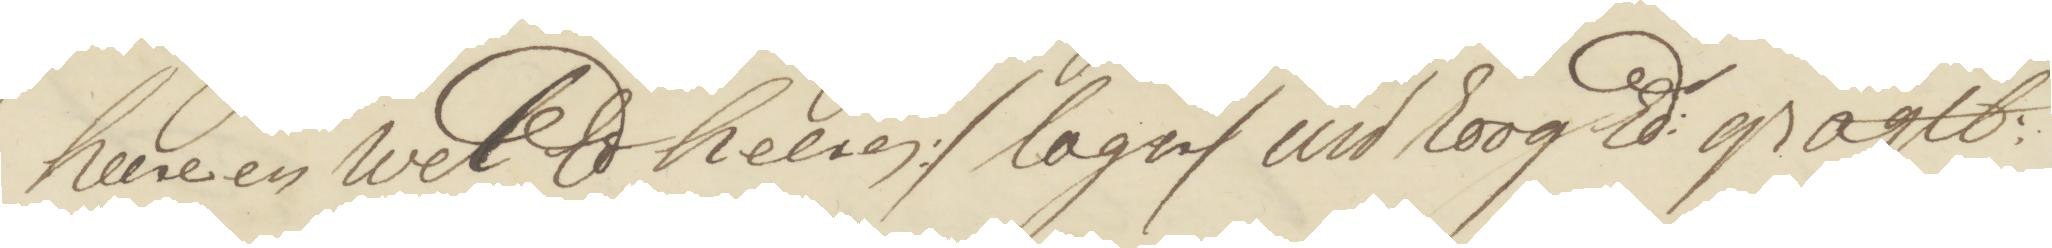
heere en wel Ed heeren :/lager/ uw hoog Ed:s gr agtb:
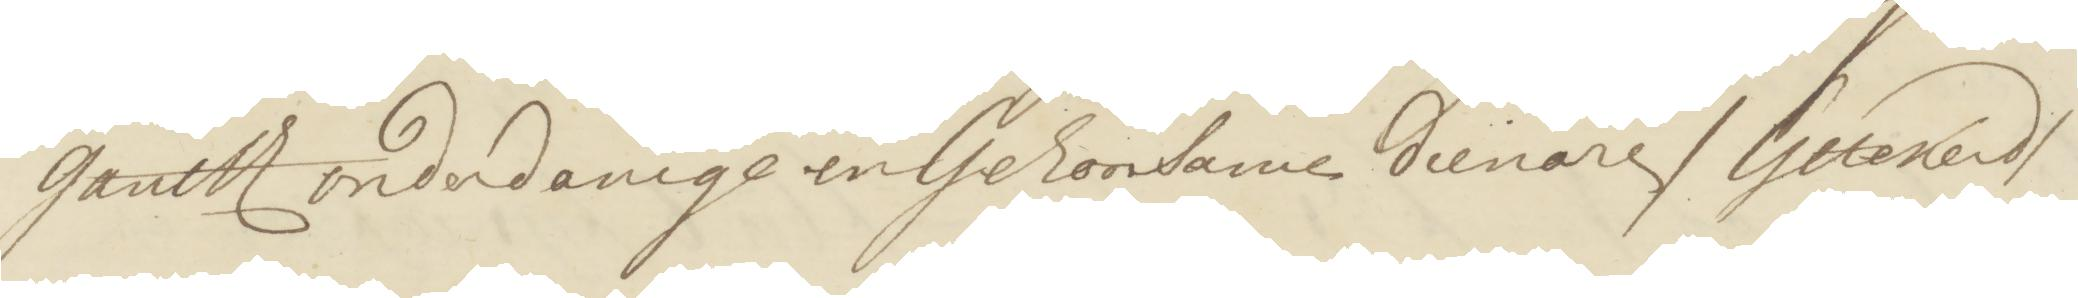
gantsh onderdanige en Gehoorsame dienare/ Getekend/
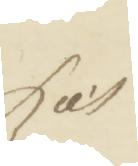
Rus
